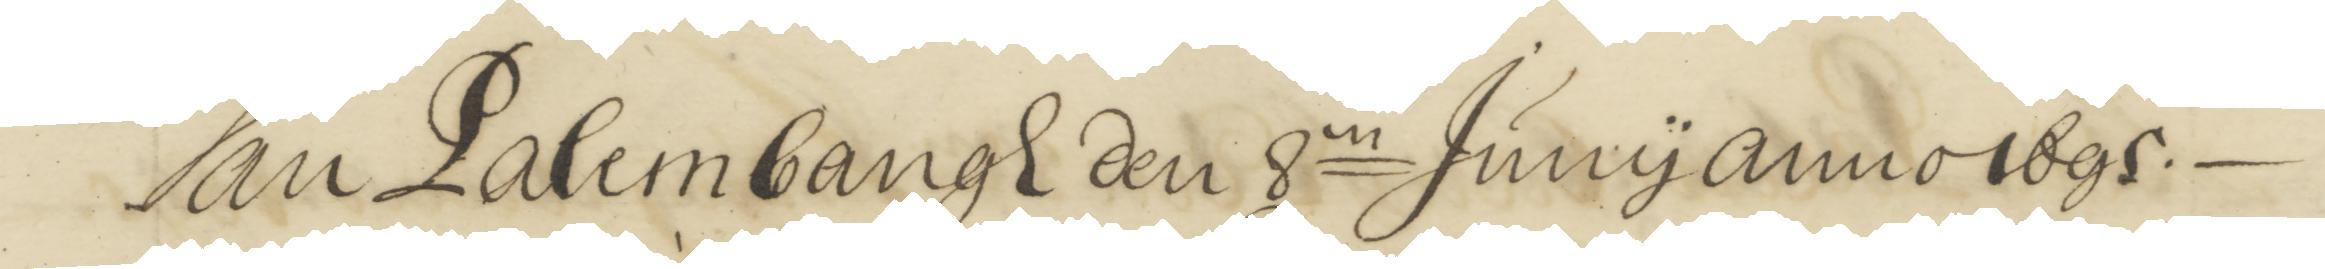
Van Palembangh den 8=en Junij anno 1695. —
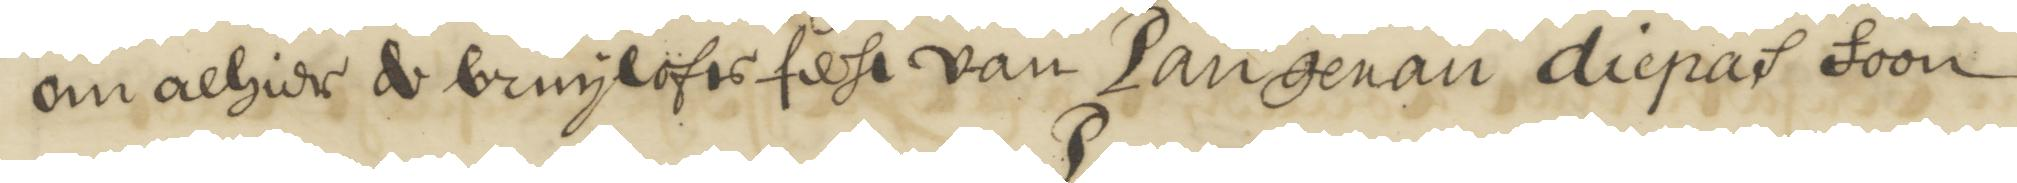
om alhier de bruijlofts feest van Pangeran diepas soon
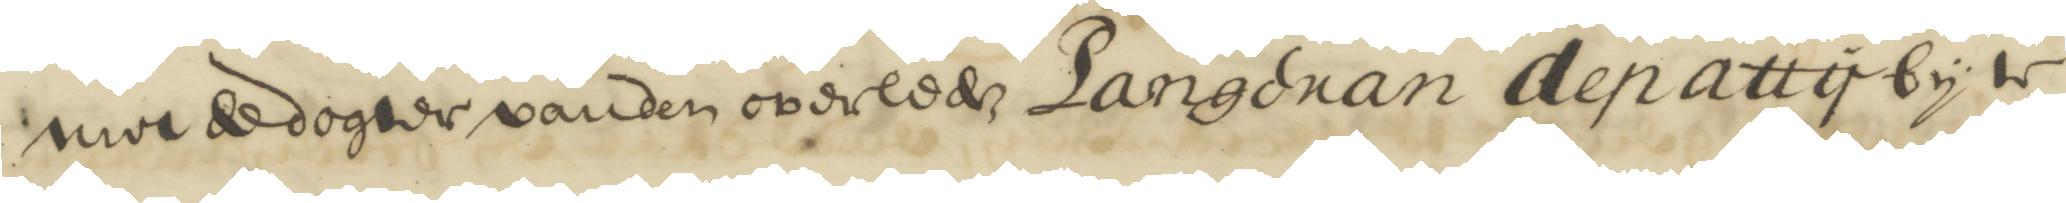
met de dogter vanden overleden Pangeran depattij bij te
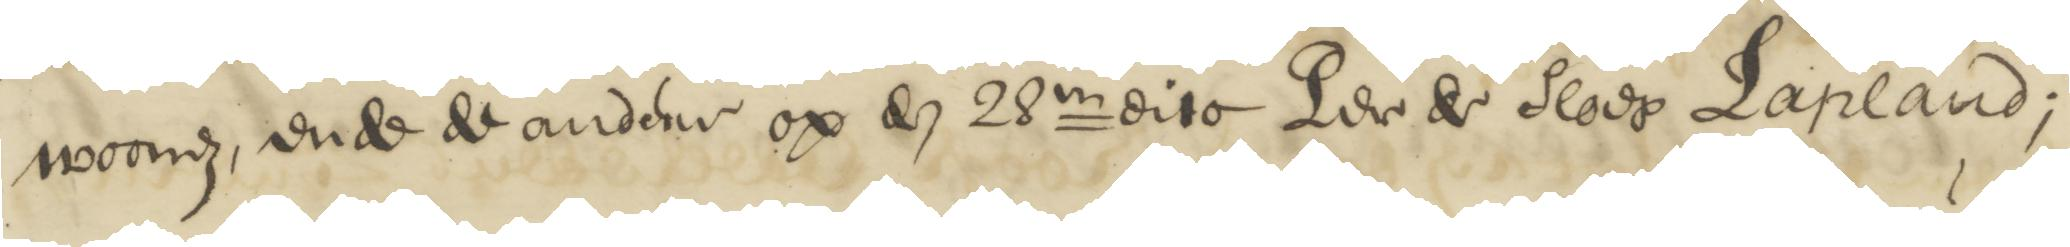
woonen, ende de andere op den 28=en dito Per de sloep Lapland;
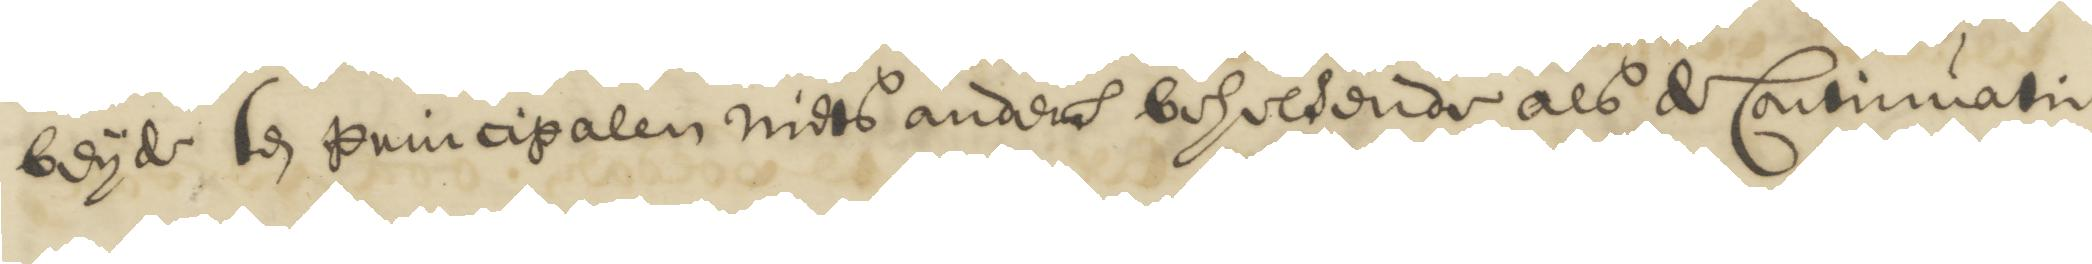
beijde ten principalen niets anders behelsende als de Continuatie
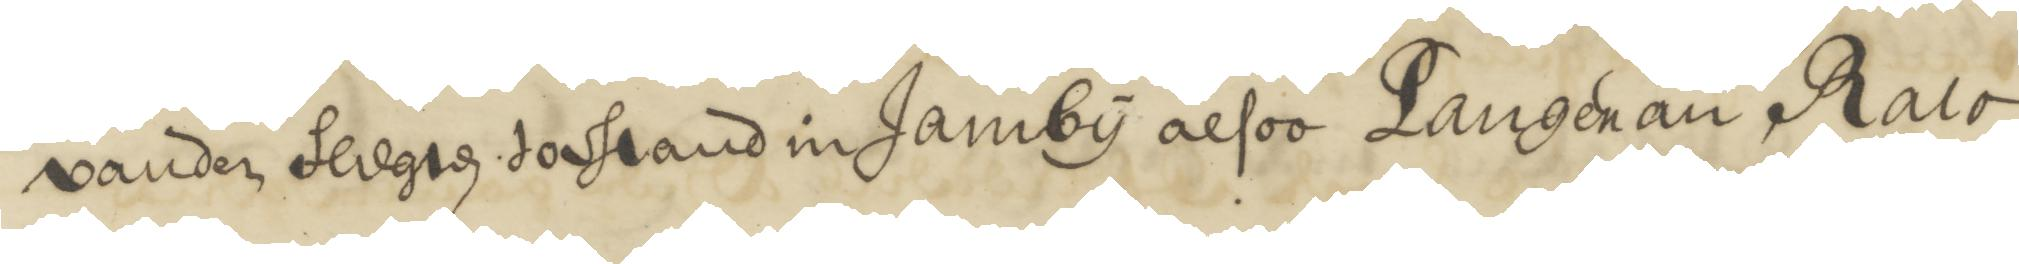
van den slegten toestand in Jambij alsoo Pangeran Rato
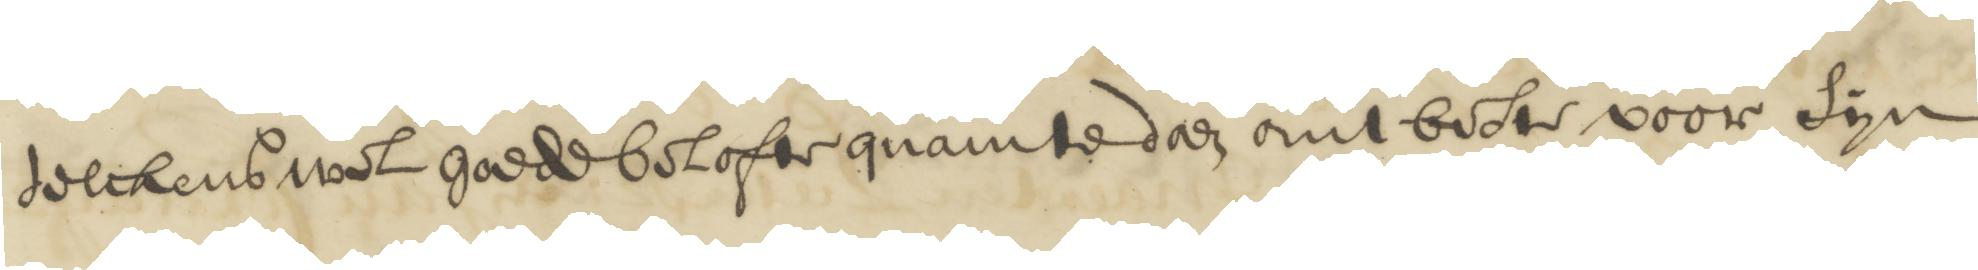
telckens wel goede belofte quam te doen om't beste voor sijn
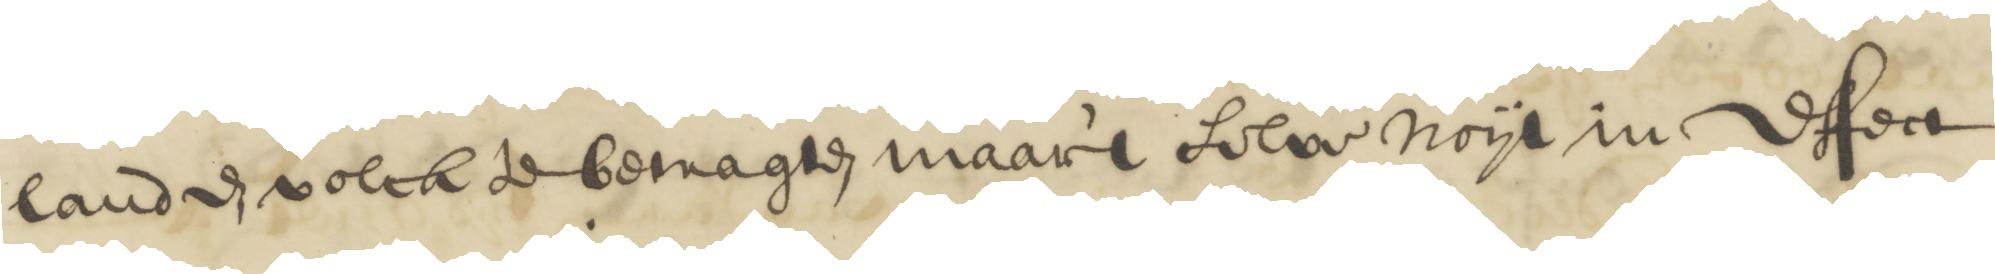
landen volck te betragten maar ’t selve noijt in Effect
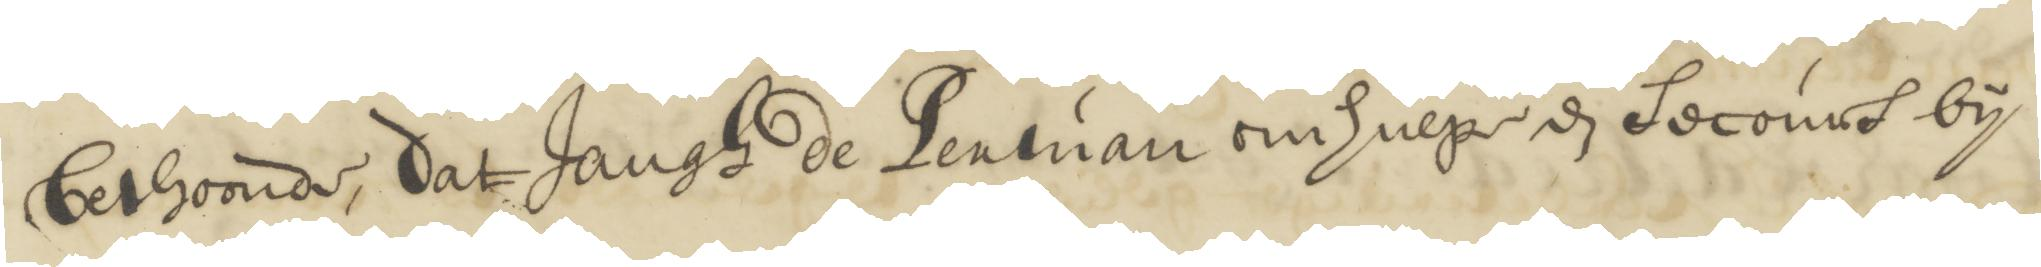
bethoonde, dat Jangh de Pertuan om hulpe en secours bij
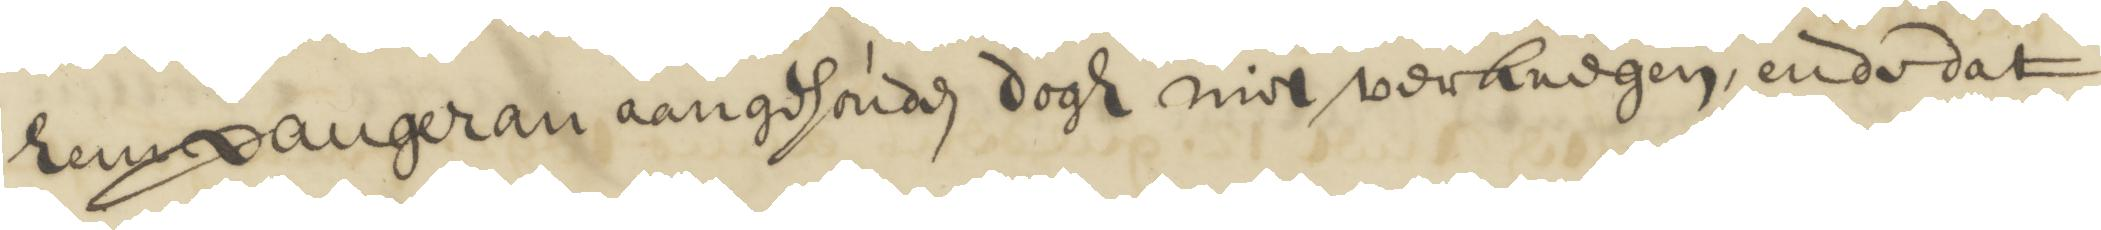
hem pangeran aangehouden dogh niet verkregen, ende dat
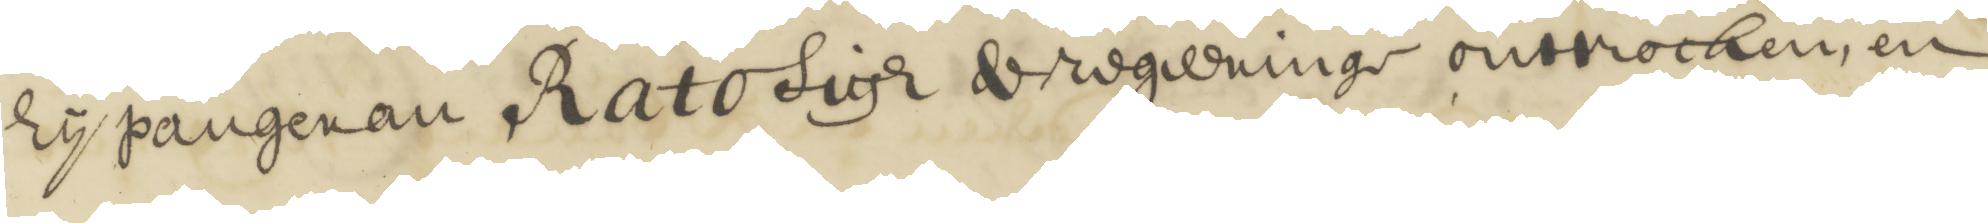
hij pangeran Rato sigh de regeeringe onttrocken, en
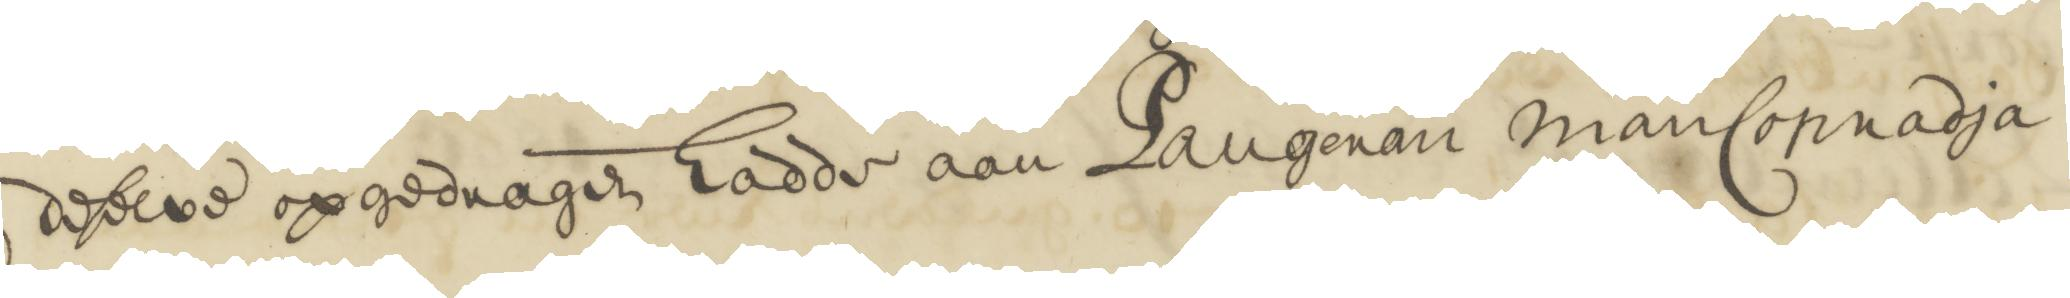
deselve opgedragen hadde aan Pangeran man Copradja
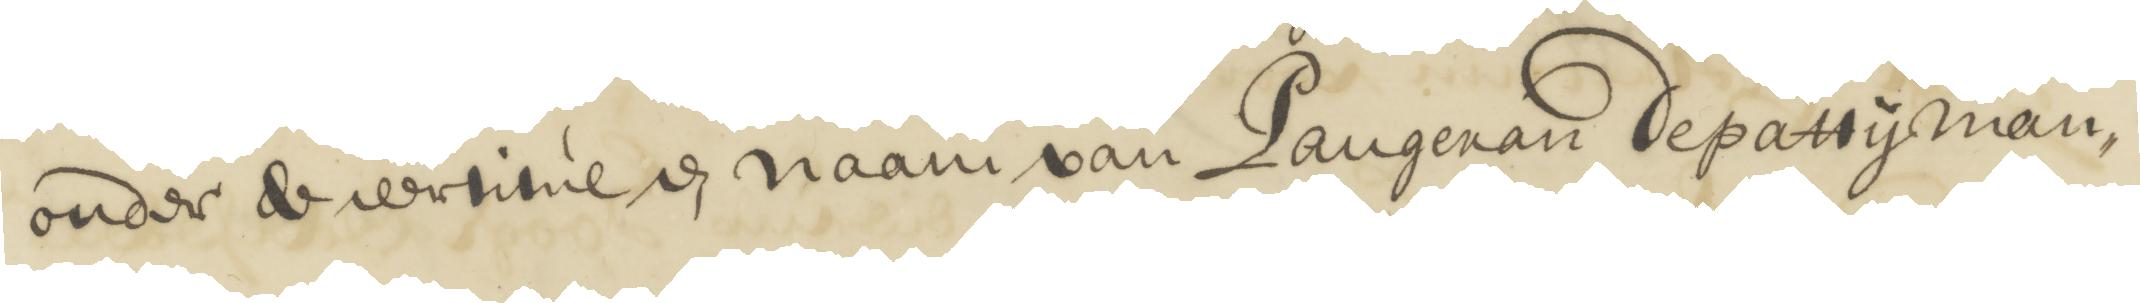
onder de eertitul en naam van Pangeran depattij man„
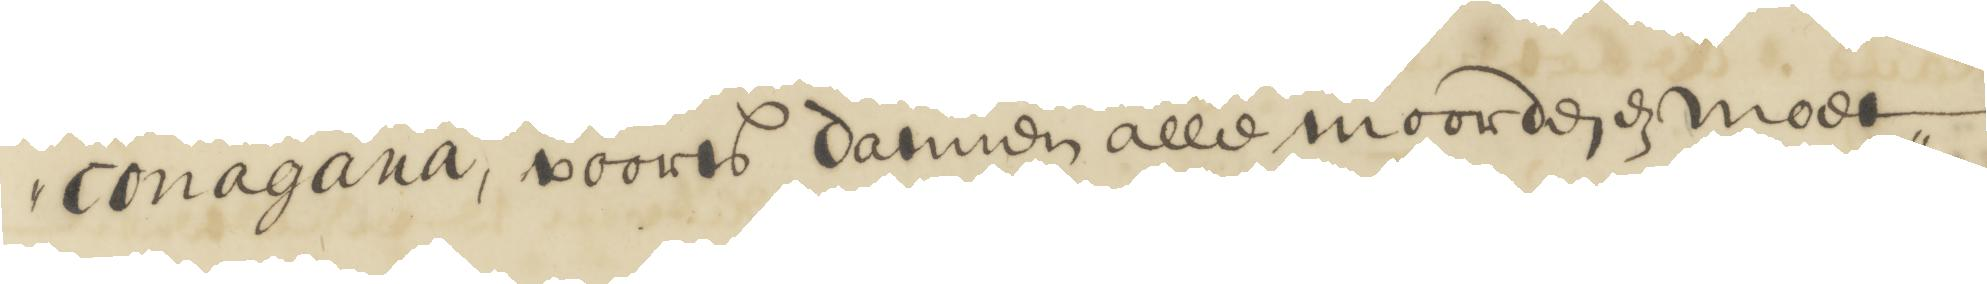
„conagara, voorts datmen alle moorden en moet„
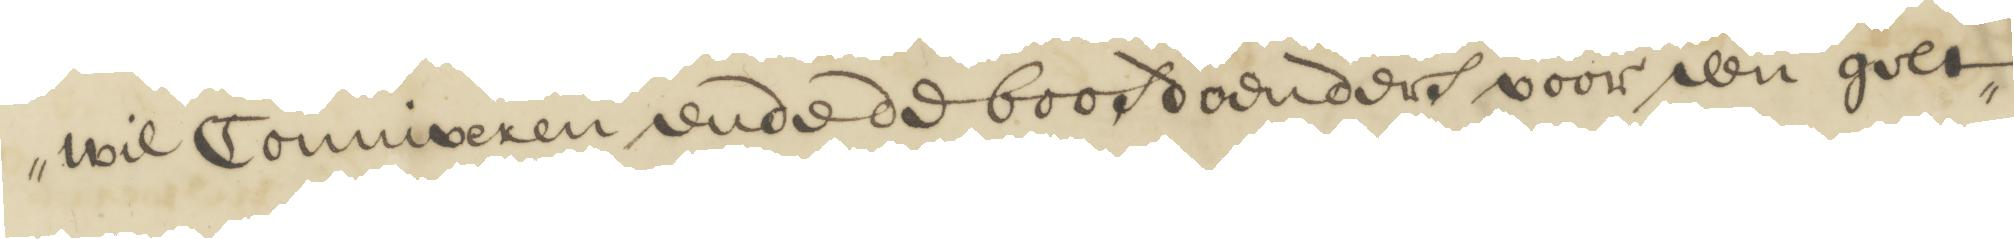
„wil Conniveren ende de boosdoenders voor een gelt„
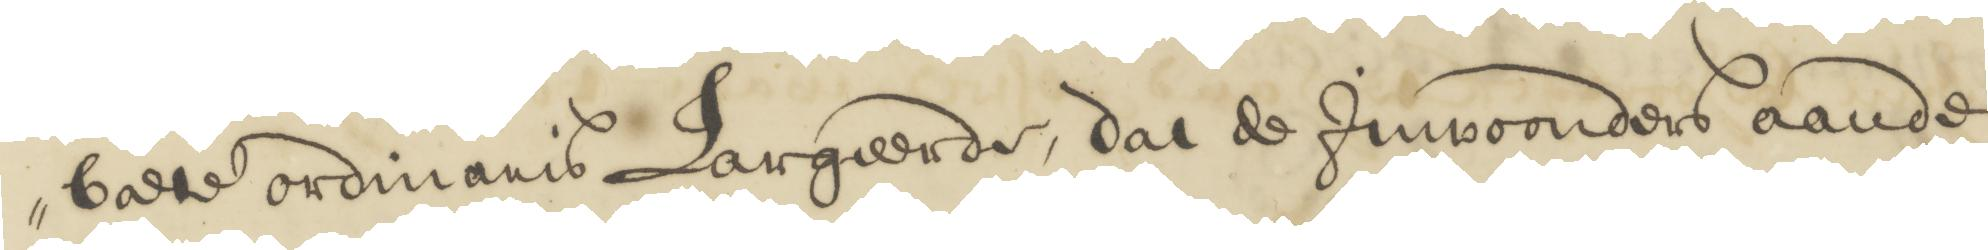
„boete ordinaris Largeerde, dat de Inwoonders aan de
